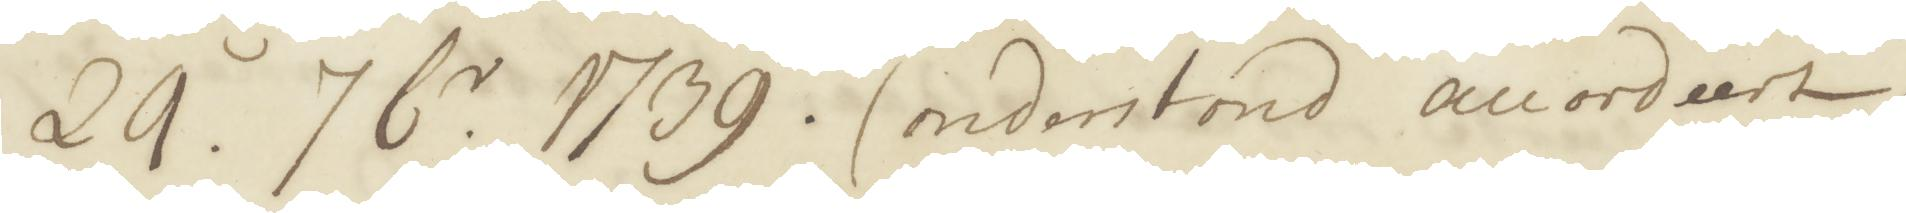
24.e 7b.r 1739. (onderstond accordeert)
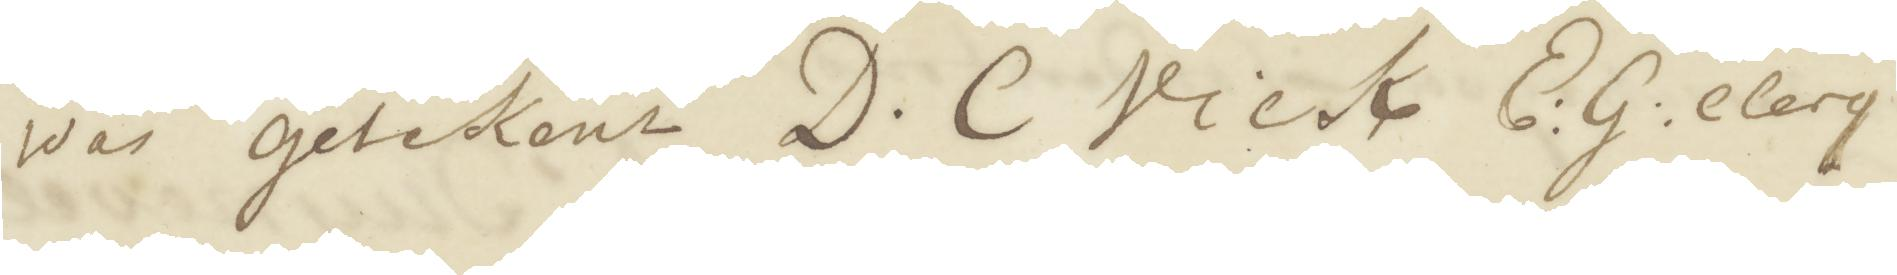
was getekent D: C viek E: G: clerq
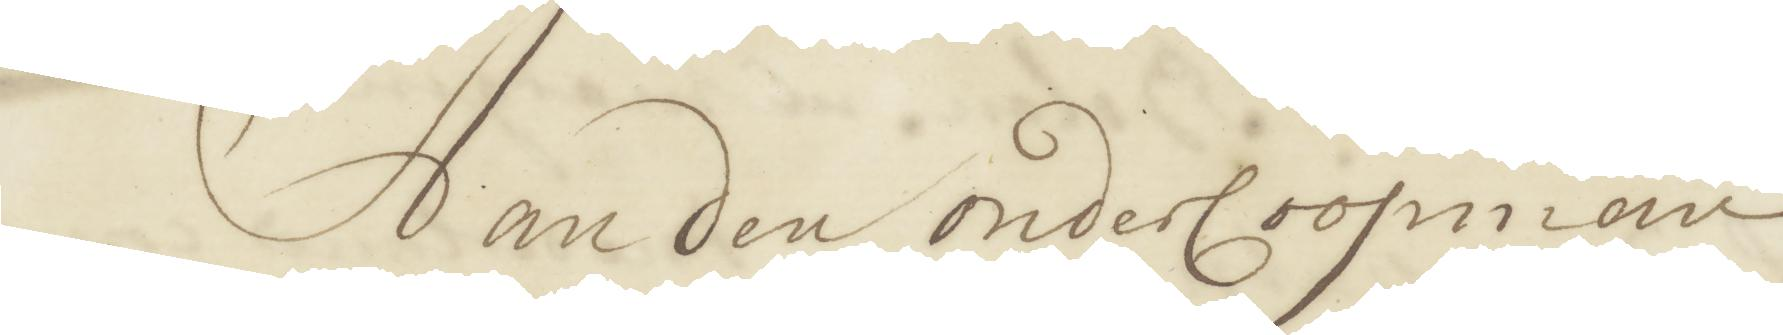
Aan den ondercoopman
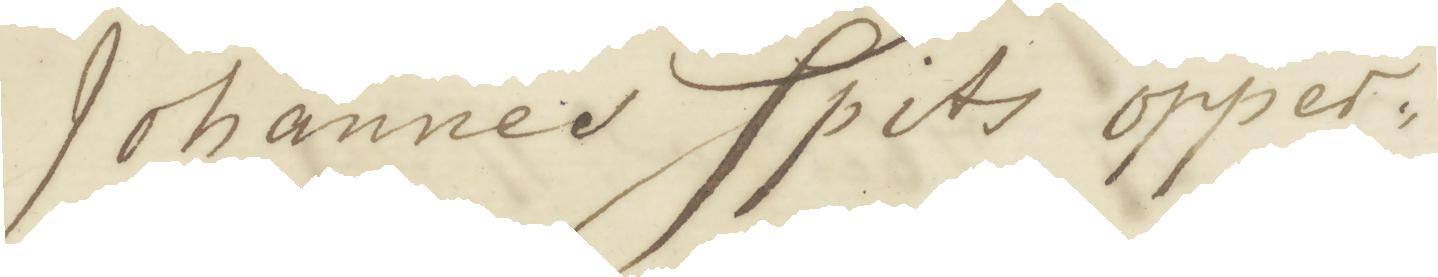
Johannes Spits opper„
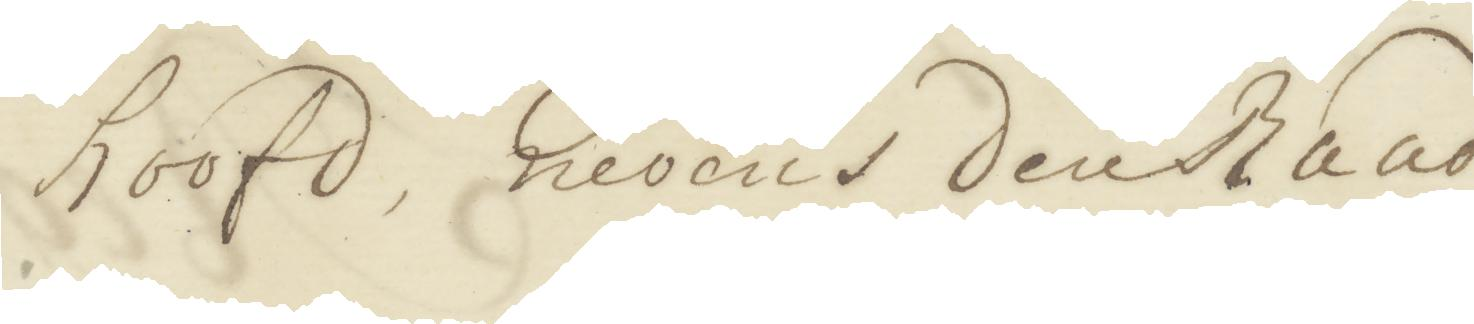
hoofd, nevens den Raad
